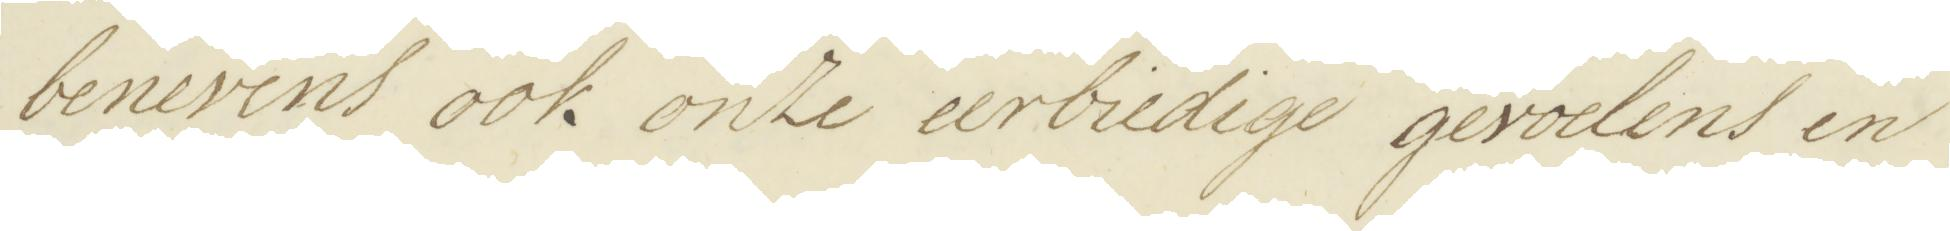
benevens ook onze eerbiedige gevoelens en
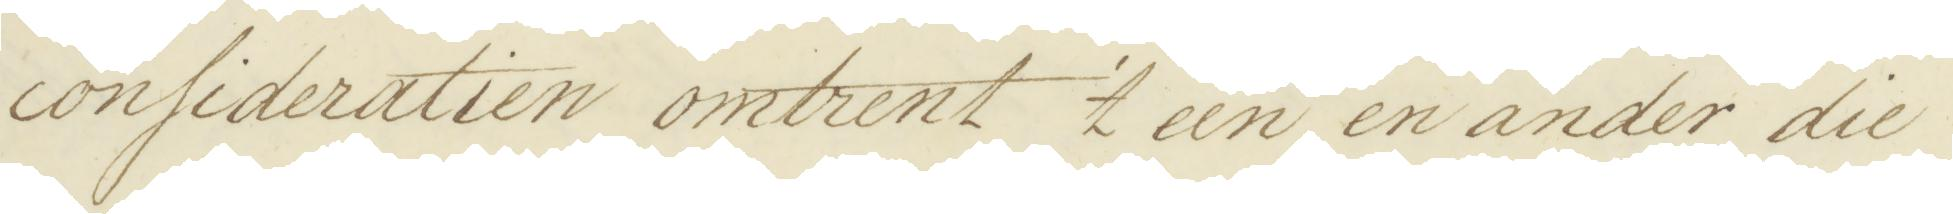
consideratien omtrent ’t een en ander, die
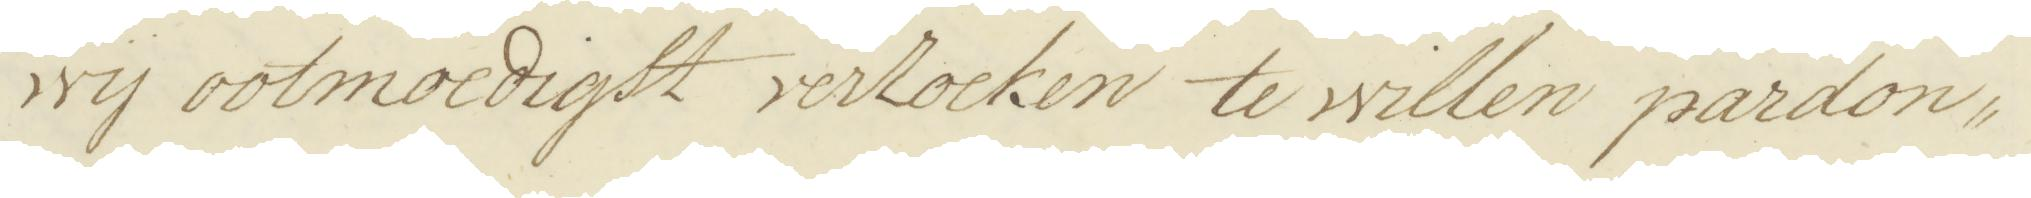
wij ootmoedigst verzoeken te willen pardon„
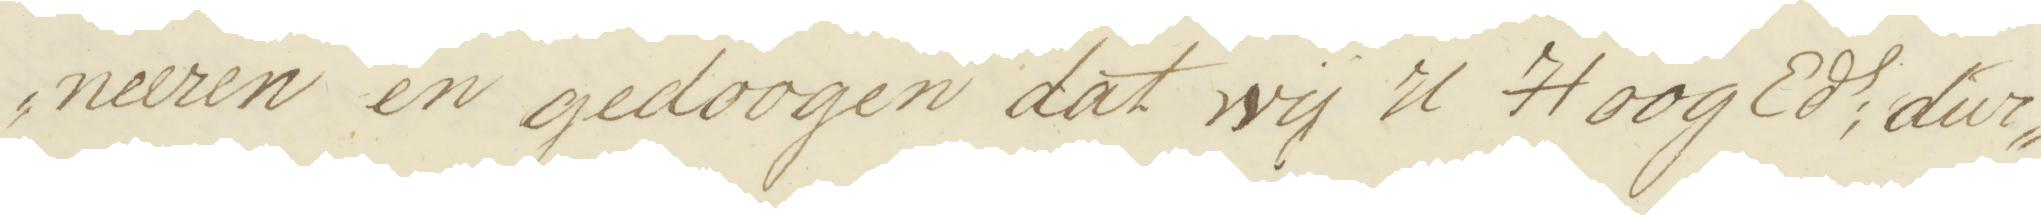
„neeren en gedoogen dat wij u Hoog Ed:s dur„
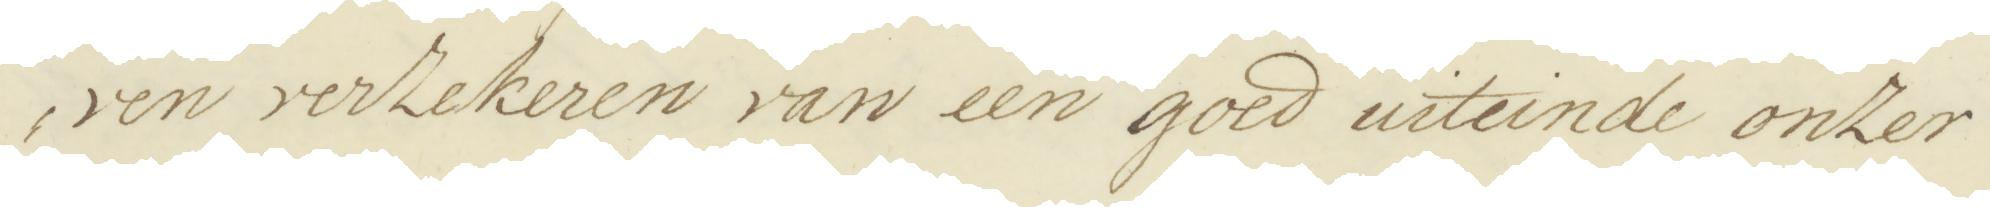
„ven verzekeren van een goed uiteinde onzer
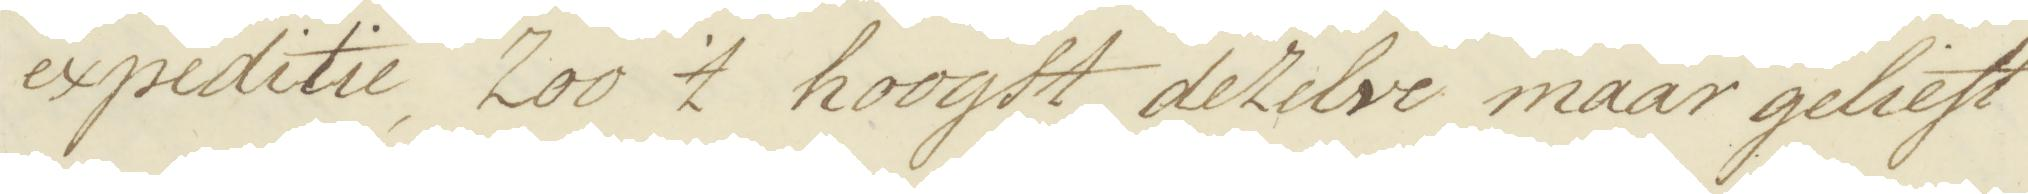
expeditie, zoo ’t hoogst dezelve maar gelieft
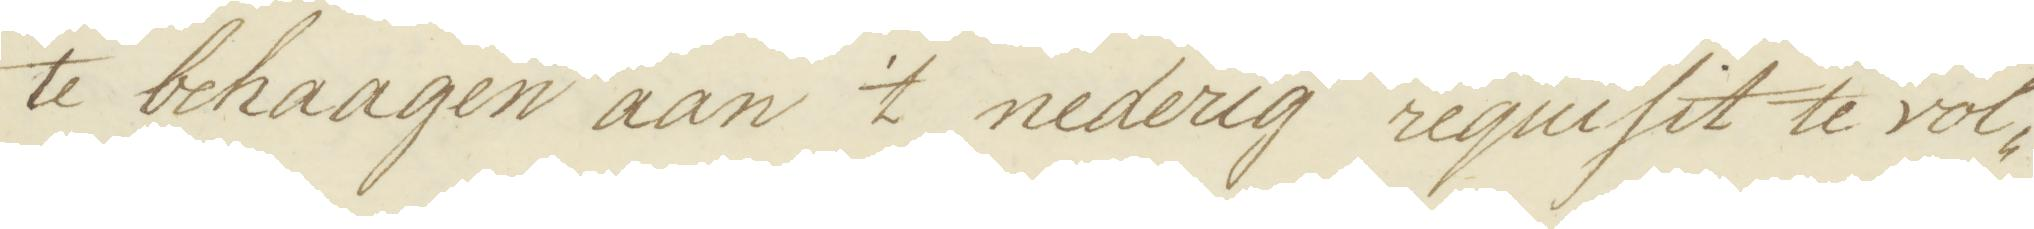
te behaagen aan ’t nederig requisit te vol„
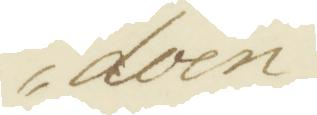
„doen
